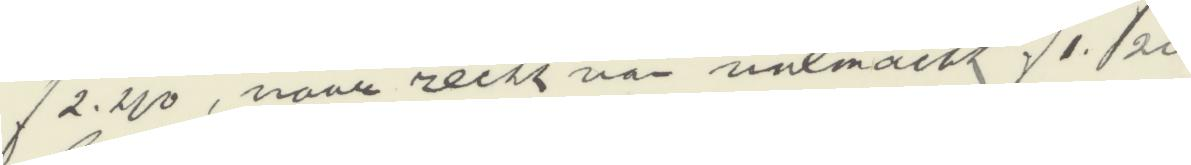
ƒ2.40, voor recht van volmacht ƒ1.20
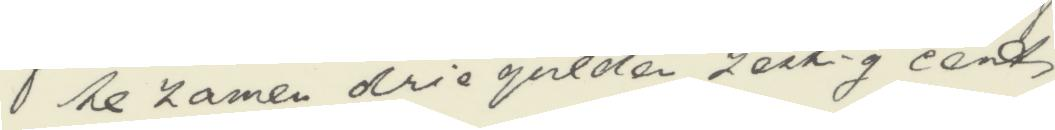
te zamen drie gulden zestig cent
